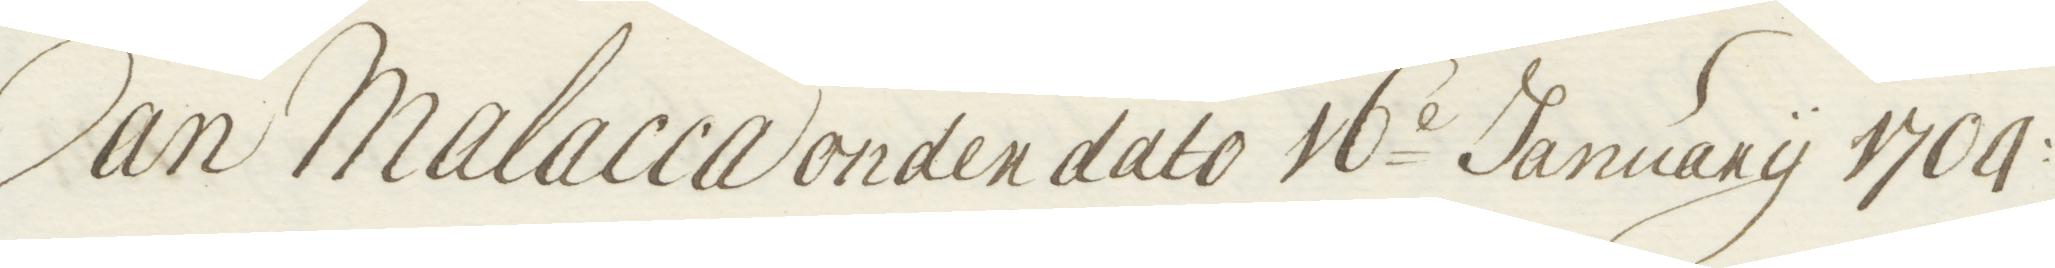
Van Malacca onder dato 16=e Januarij 1704:
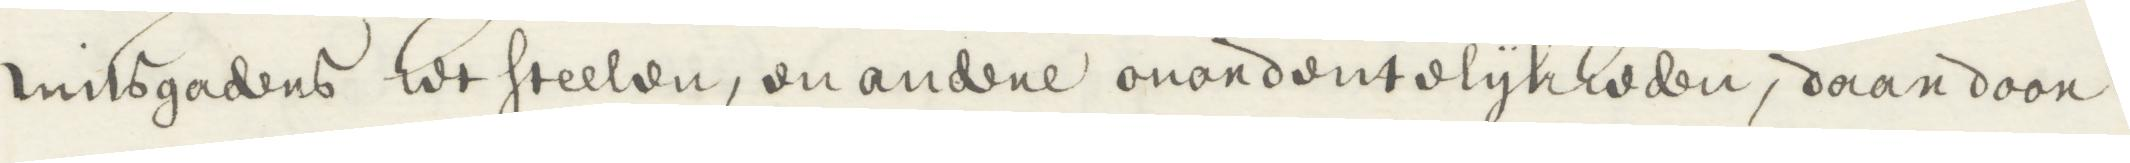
mitsgaders het steelen, en andere onordentelijkheden, daar door
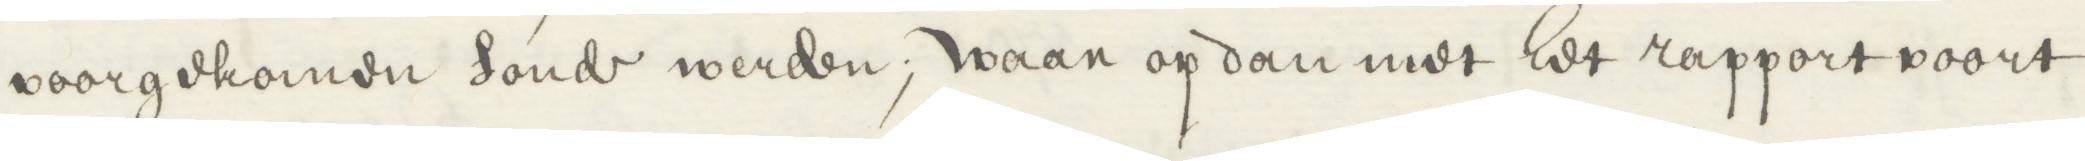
voorgekomen soude werden; waar op dan met het rapport voort
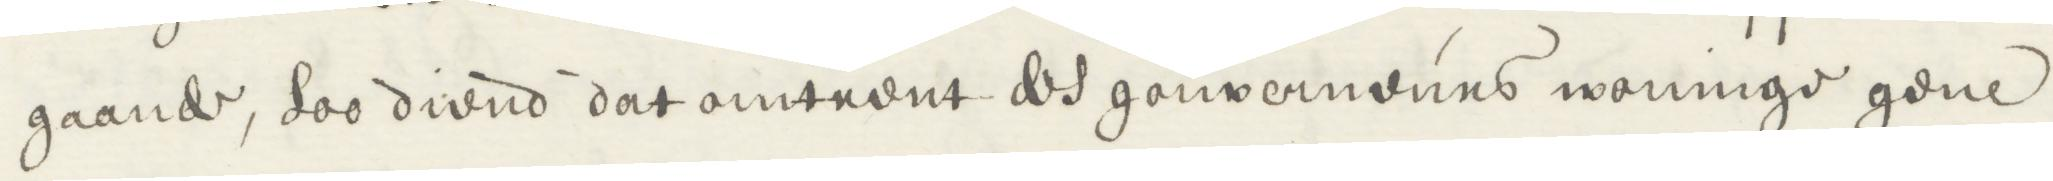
gaande, soo diend dat omtrent des gouverneurs woninge gene
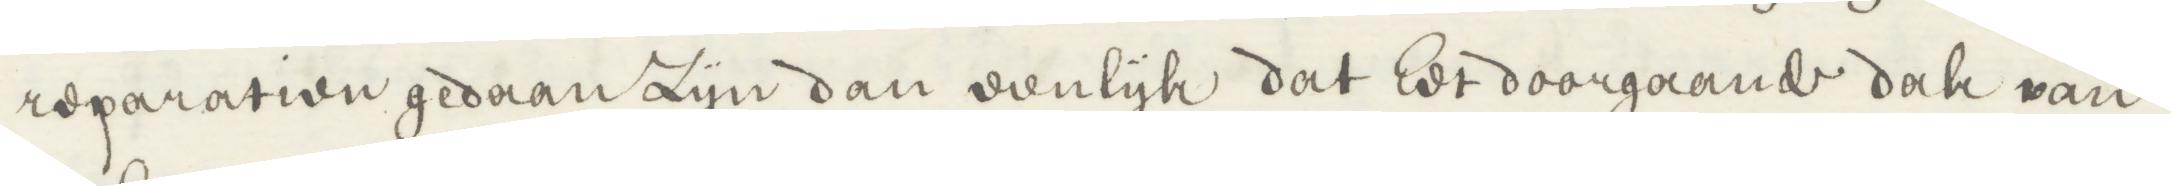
reparatien gedaan zijn dan eenlijk dat het doorgaande dak van
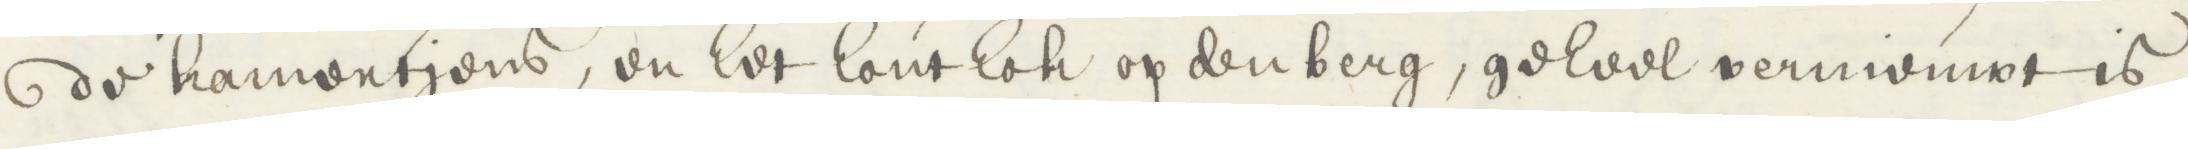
de kamertjens, en het houthok op den berg, geheel vernieuwt is
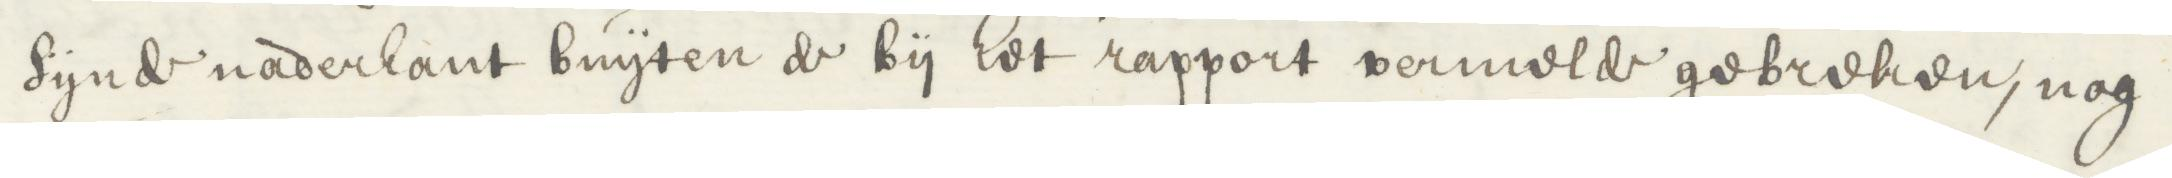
sijnde naderhant buijten de bij het rapport vermelde gebreken, nog
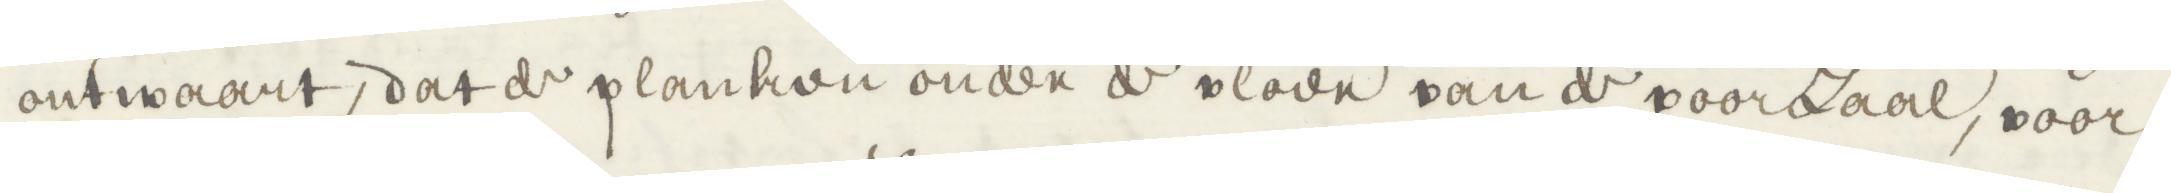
ontwaart, dat de planken onder de vloer van de voorzaal, voor
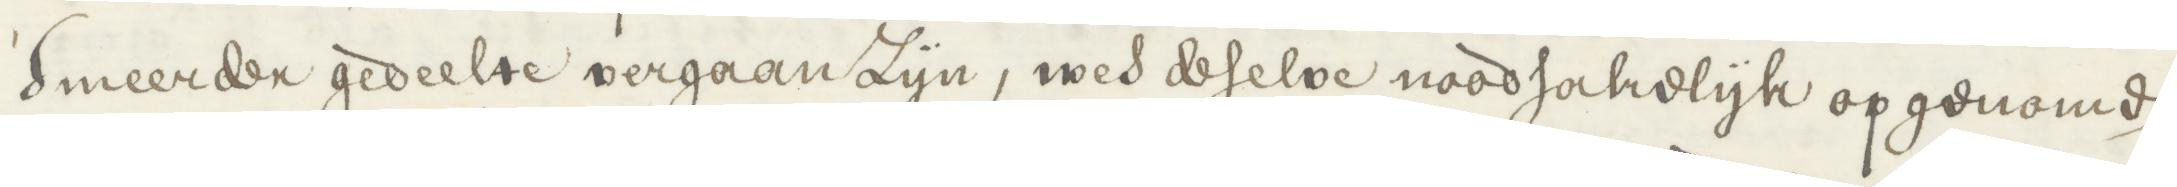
't meerder gedeelte vergaan zijn, wes deselve noodsakelijk op genomen
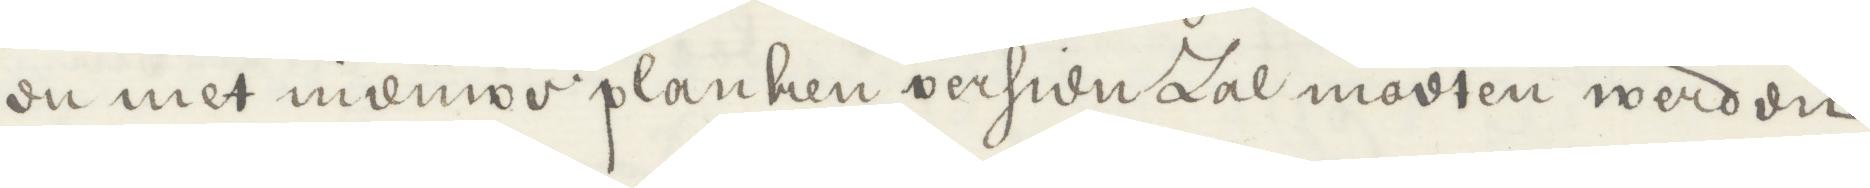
en met nieuwe planken versien zal moeten werden
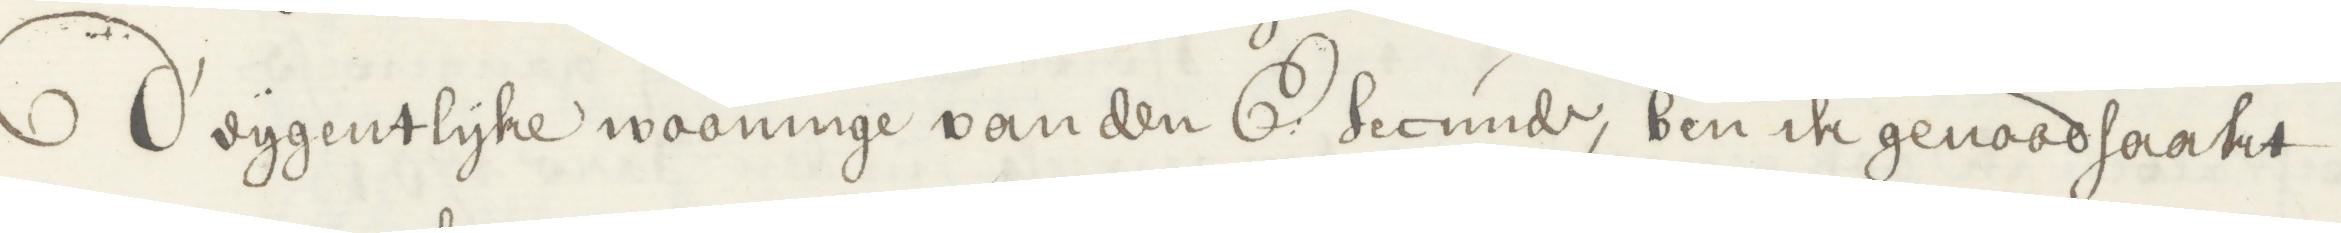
D’eijgentlijke wooninge van den E: secunde, ben ik genoodsaakt
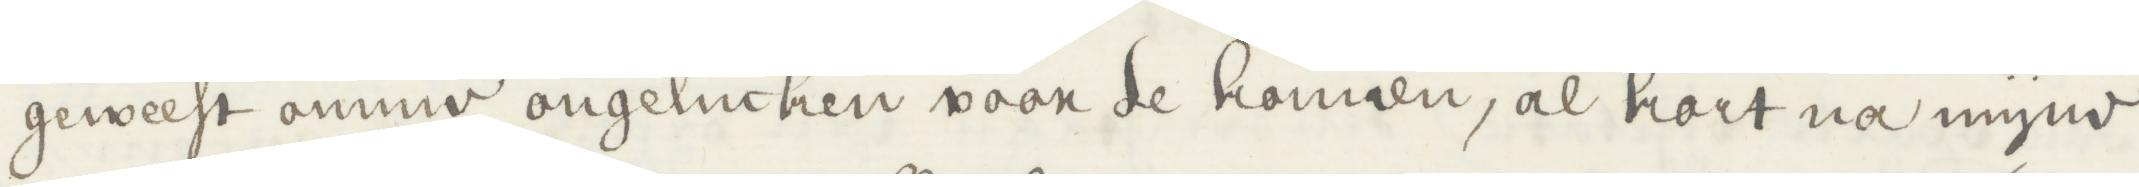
geweest omme ongelucken voor te komen, al kort na mijne
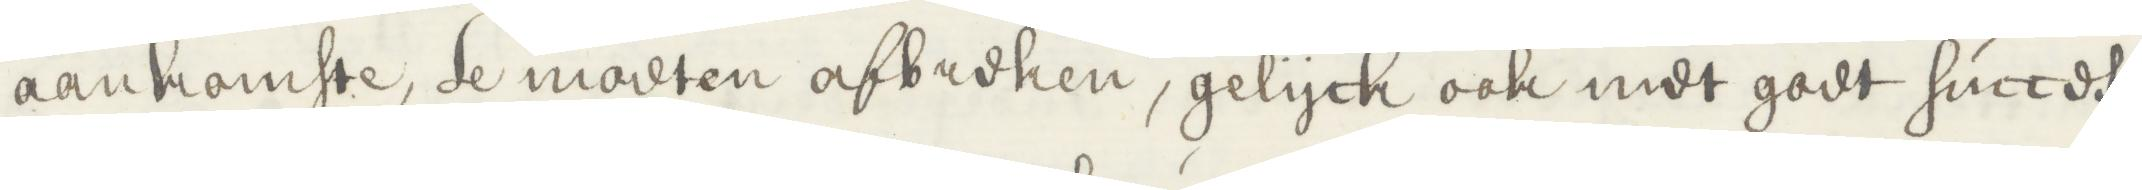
aankomste, te moeten afbreken, gelijck ook met goet succes
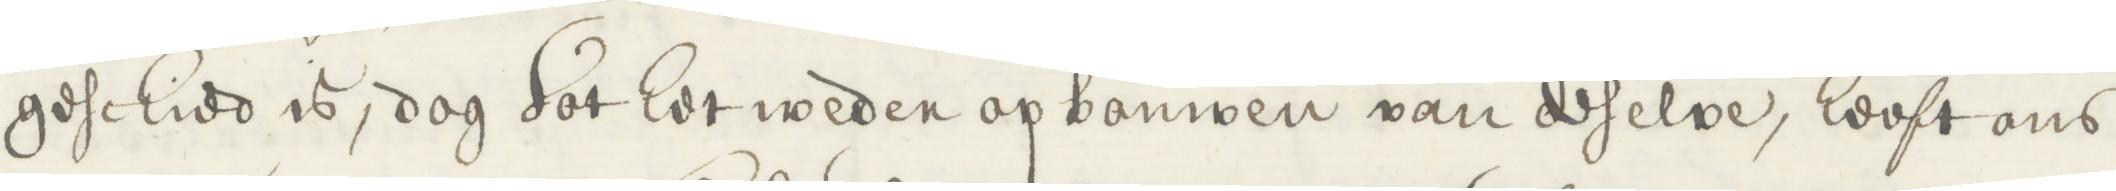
geschied is, dog tot het weder op bouwen van deselve, heeft ons
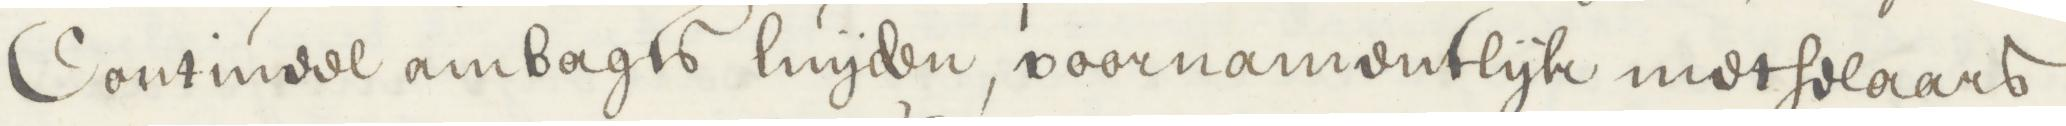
Continueel ambagts luijden, voornamentlijk metselaars
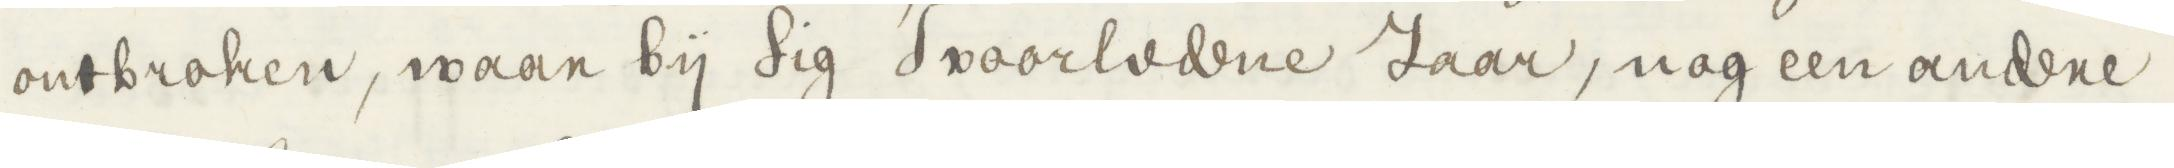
ontbroken, waar bij sig 't voorledene Jaar, nog een andere
